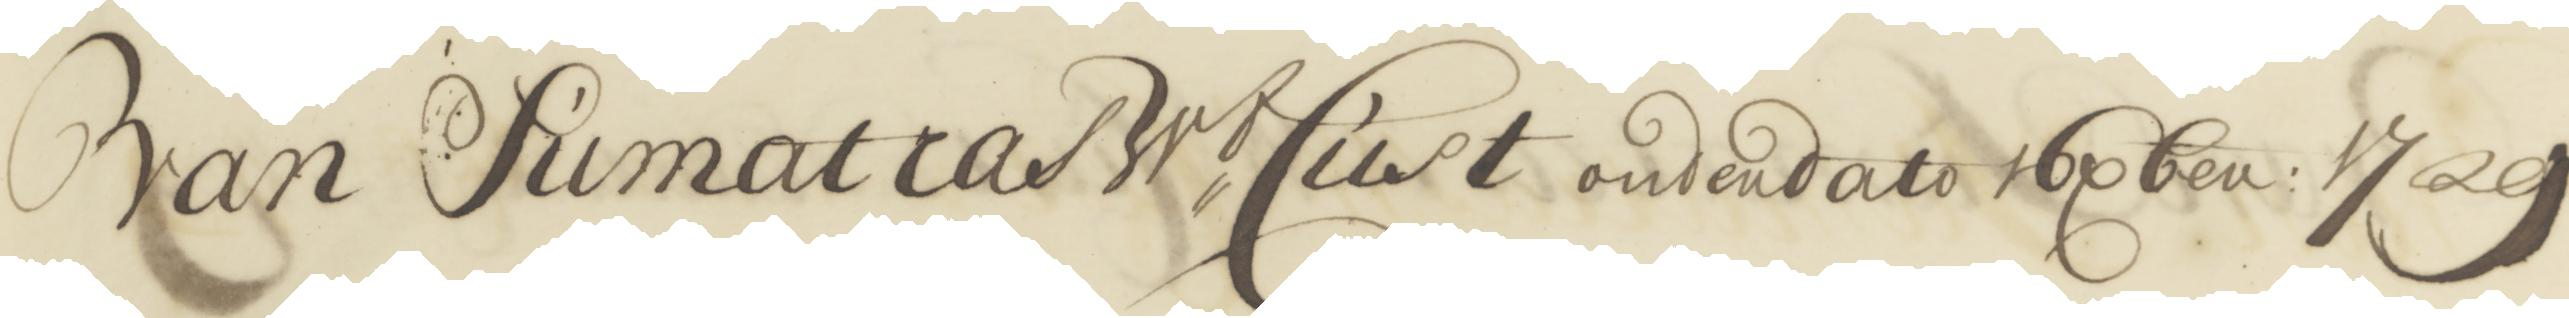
Van Sumatras W„t Cust onderdato 16xber: 1729
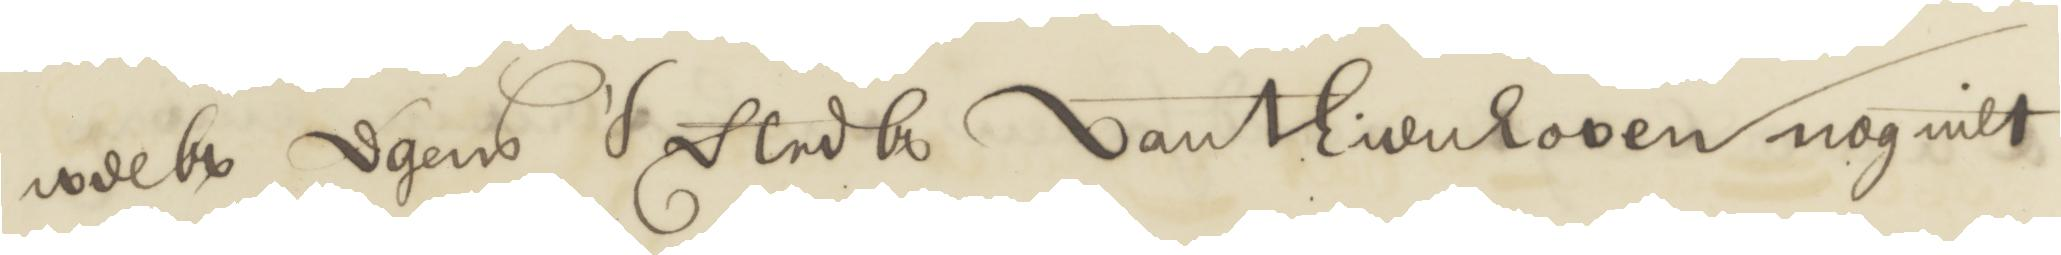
welk tegens ’t vertrek van thienhoven nog niet
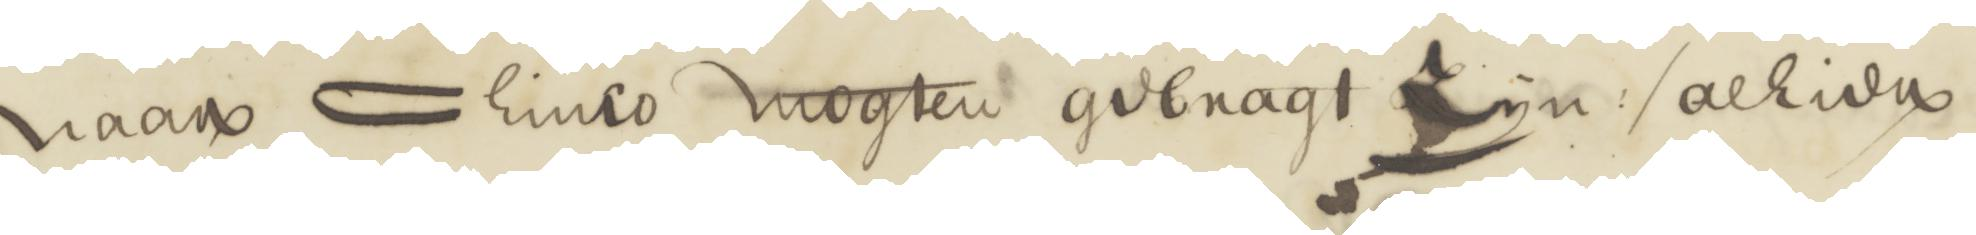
naar Chinco mogten gebragt Zijn :/ alhier
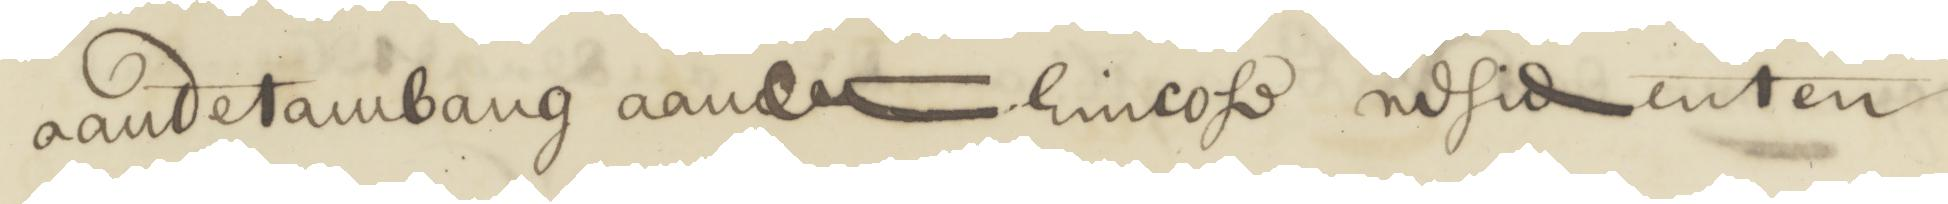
aandetambang aande Chincose residenten
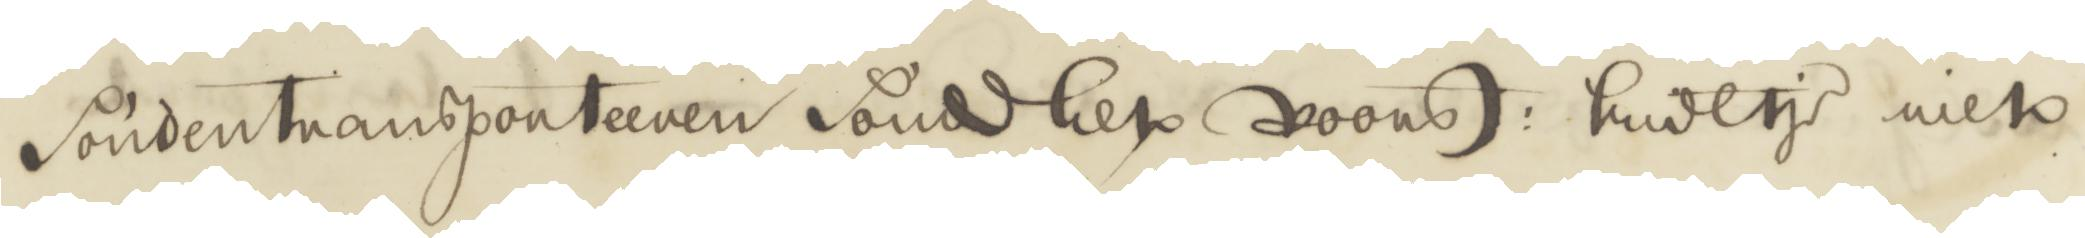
souden transporteeren soude het voors: kieltje niet
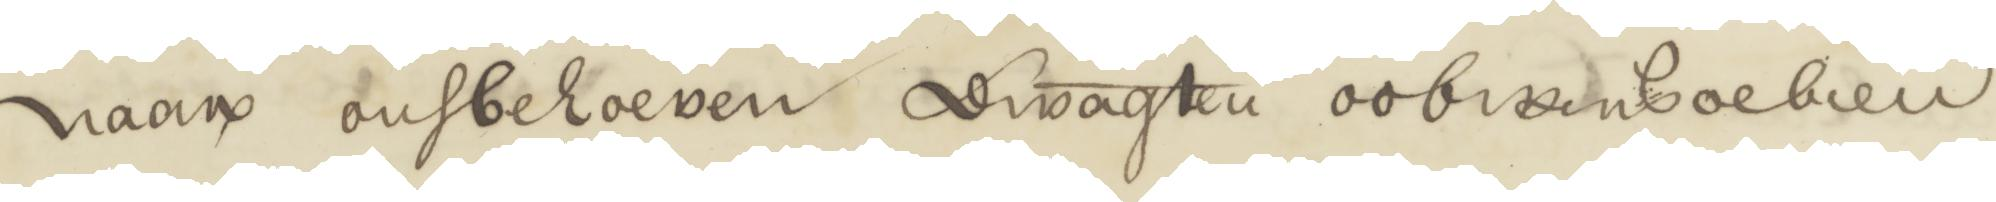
naar onsbehoeven tewagten ookversoeken
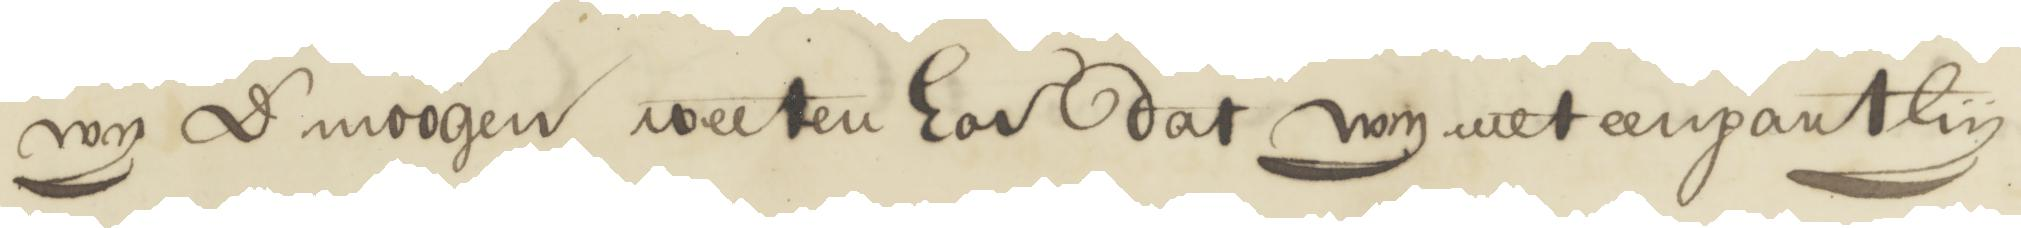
wy te moogen weeten hoe dat wy met eenparthij
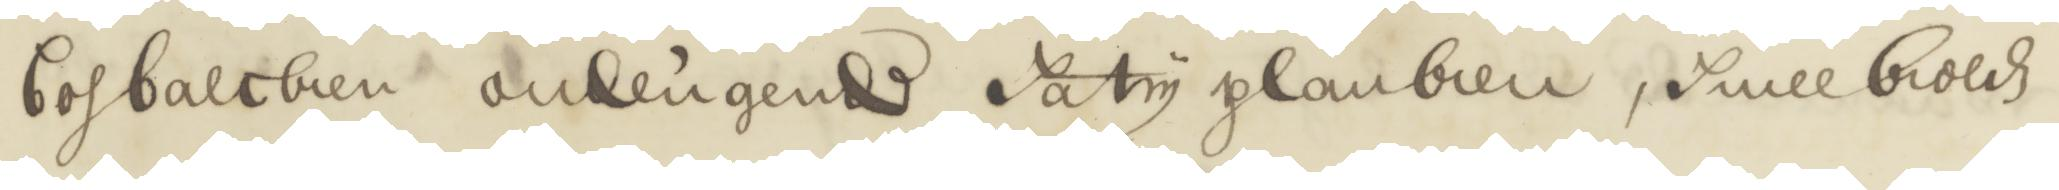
bosbalcken ondeugende satij planken, smee kolen
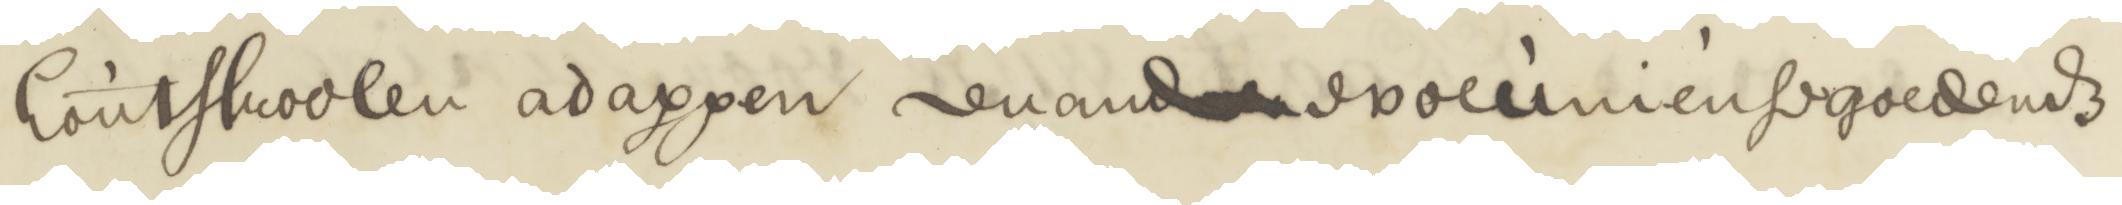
houtskoolen adappen en andere volunieusegoederen
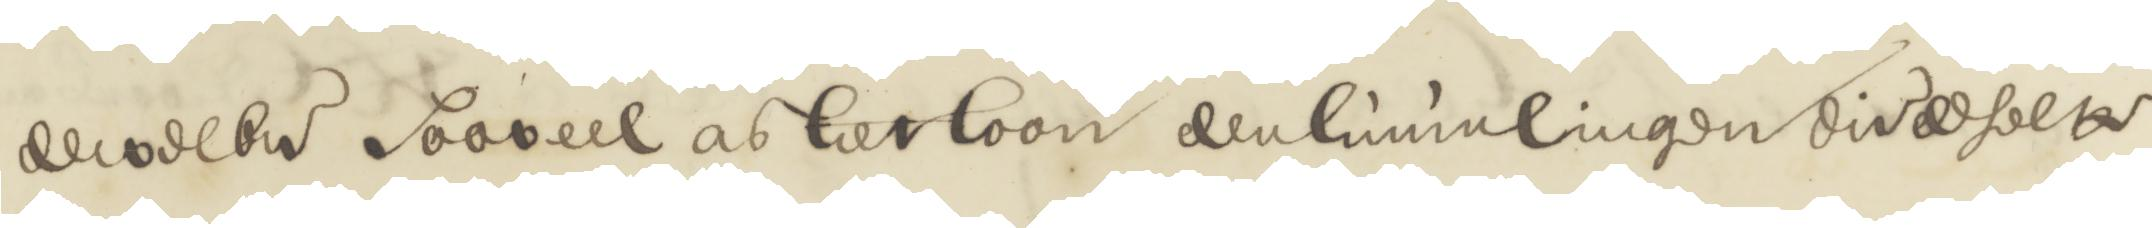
dewelke sooveel as het loon den huurlingen die deselve
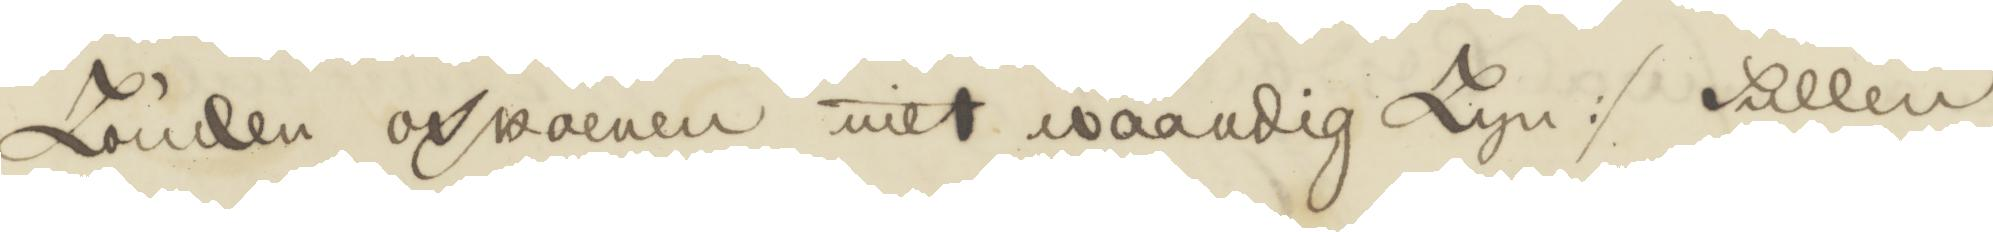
zouden overvoeren niet waardig Zyn :/ sullen
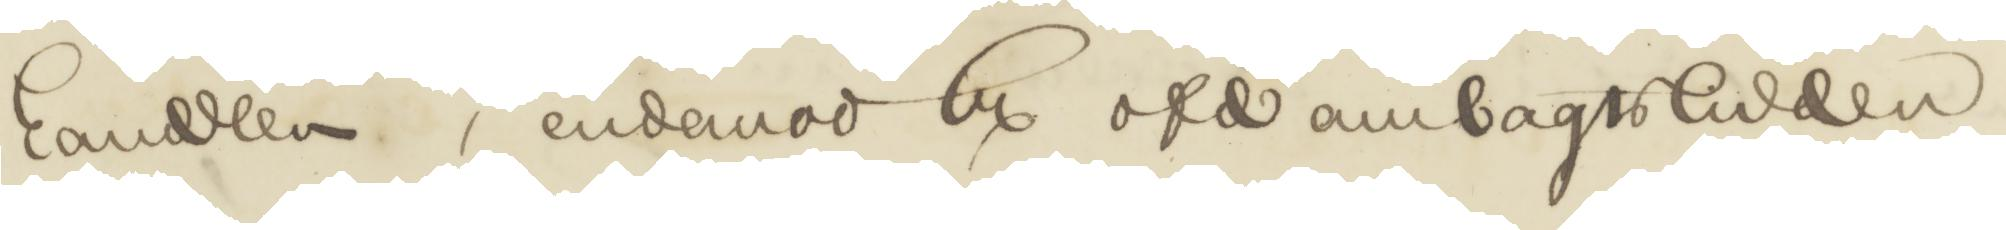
handelen; en danook ofde ambagtslieden
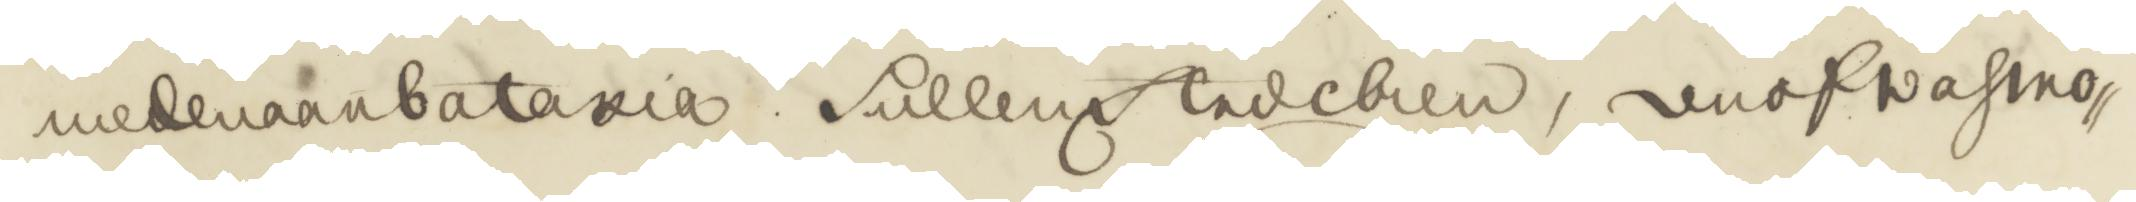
medenaar batavia sullen vertrecken, en ofte astro„
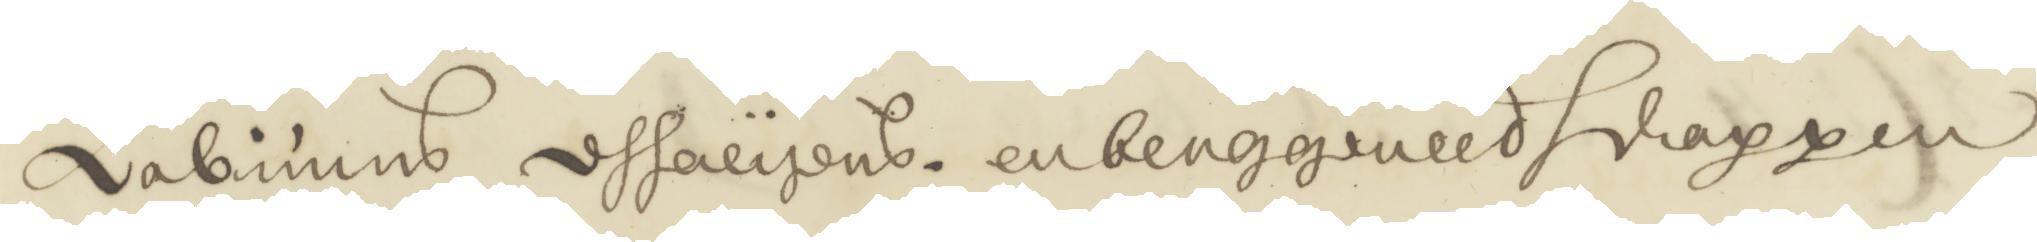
Labiums essaeijens. en berggereedschappen
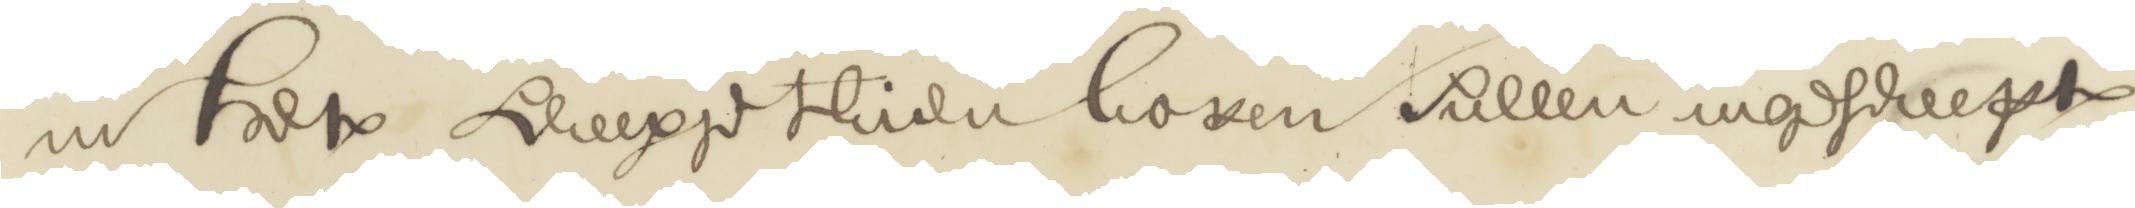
in het scheepje thien hoven sullen ingescheept
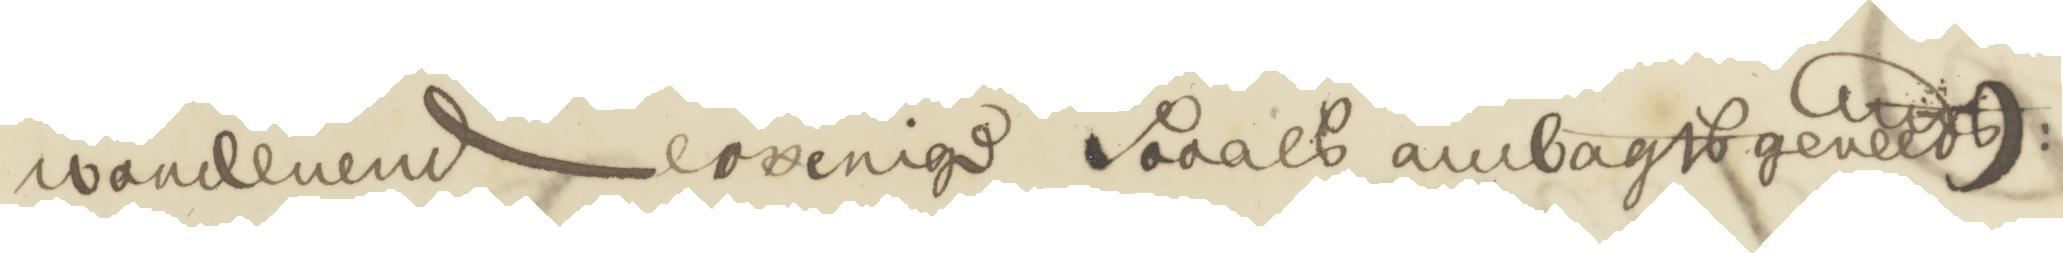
worden ende overige soo als ambagts gereeds:
